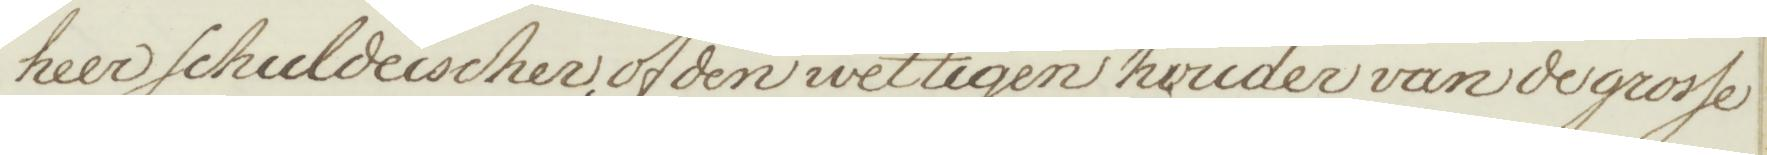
heer schuldeischer, of den wettigen houder van de grosse
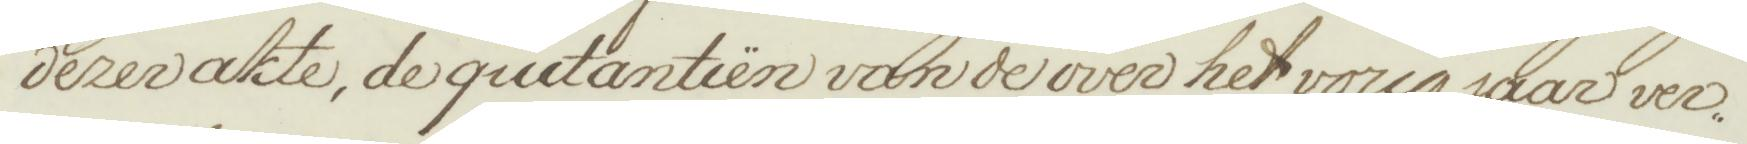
dezer akte, de quitantien van de over het vorig jaar ver„
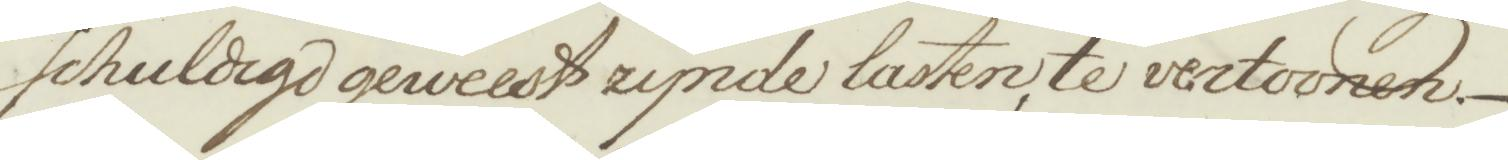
schuldigd geweest zynde lasten, te vertoonen.—
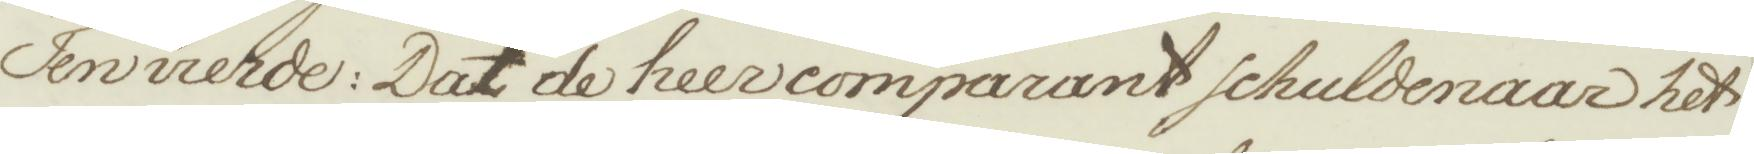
Ten vierde: Dat de heer comparant schuldenaar het
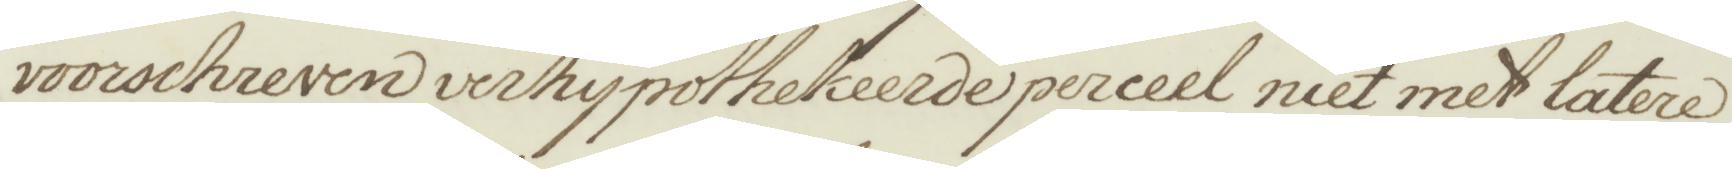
voorschreven verhypothekeerde perceel niet met latere
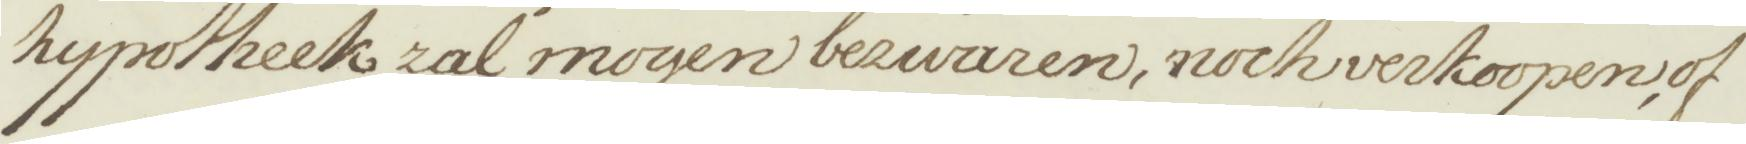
hypotheek zal mogen bezwaren, noch verkoopen, of
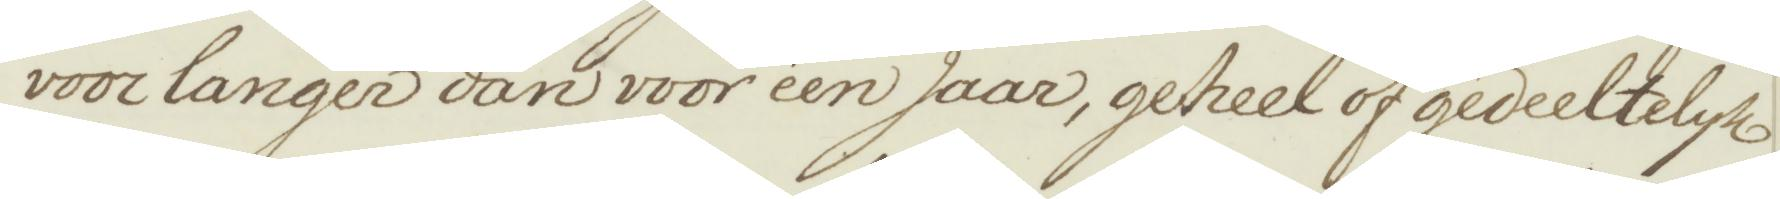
voor langer dan voor één Jaar, geheel of gedeeltelyk
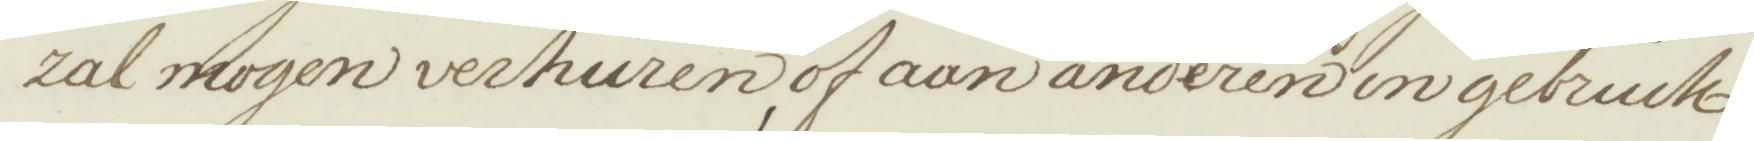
zal mogen verhuren, of aan anderen in gebruik
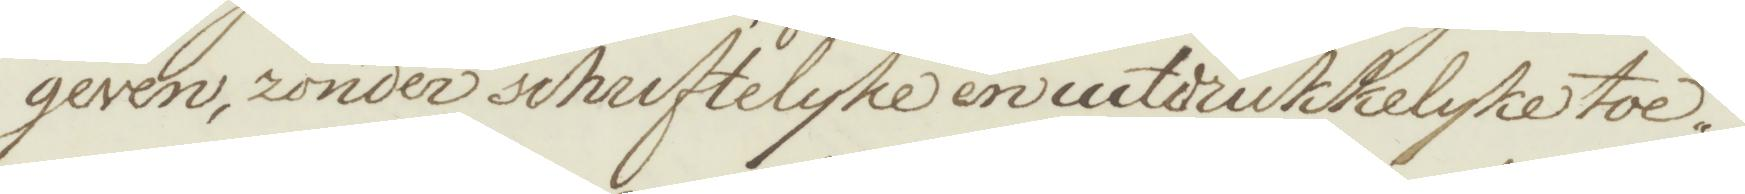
geven, zonder schriftelyke en uitdrukkelyke toe„
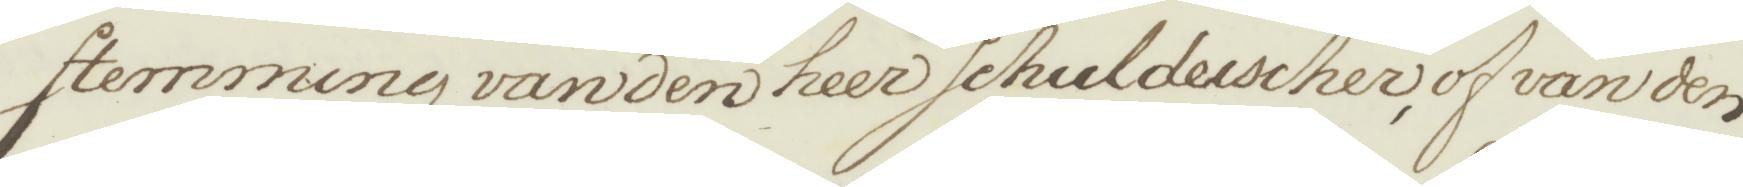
stemming van den heer schuldeischer, of van den
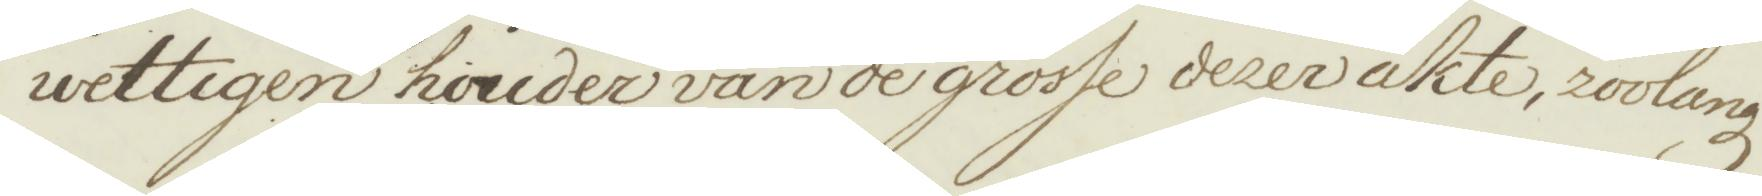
wettigen houder van de grosse dezer akte, zoolang
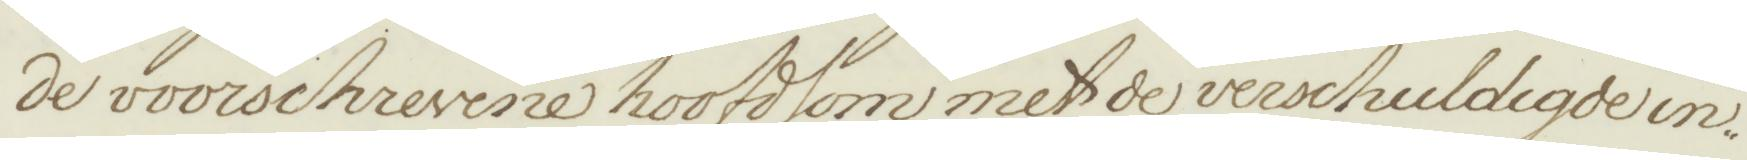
de voorschrevene hoofdsom met de verschuldigde in„
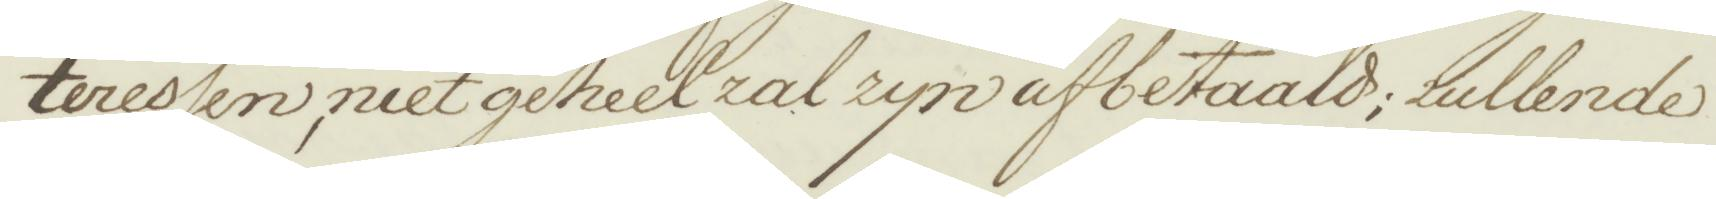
teressen, niet geheel zal zyn afbetaald; zullende
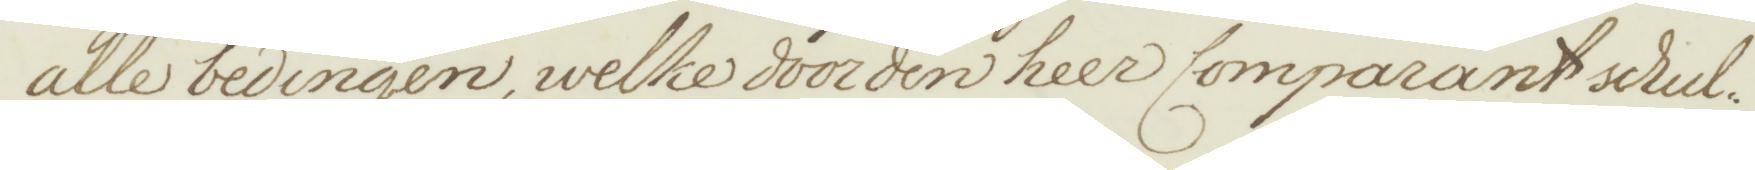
alle bedingen, welke door den heer Comparant schul„
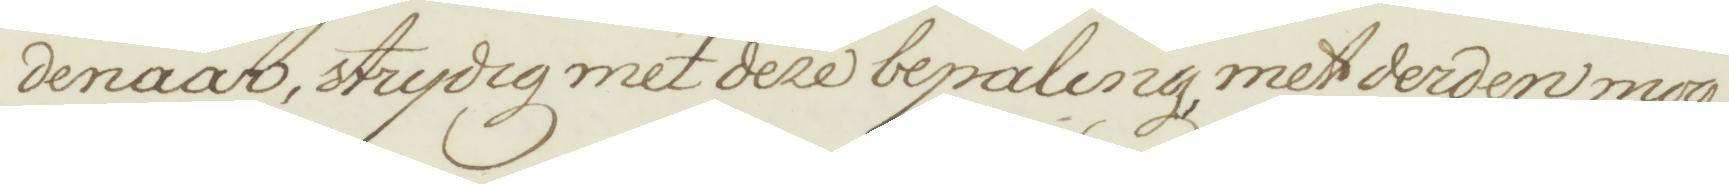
denaar, strydig met deze bepaling, met derden mog
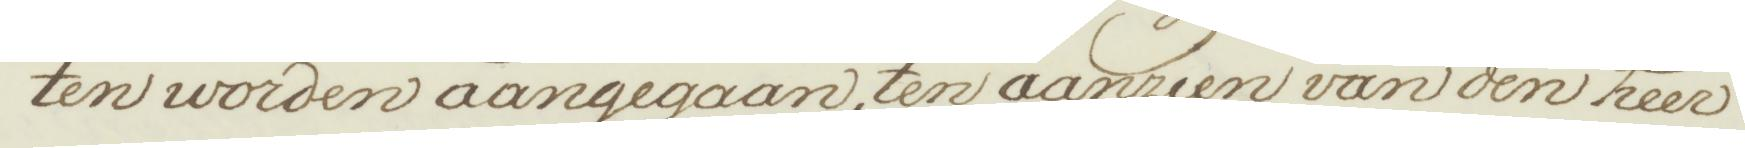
ten worden aangegaan, ten aanzien van den heer
